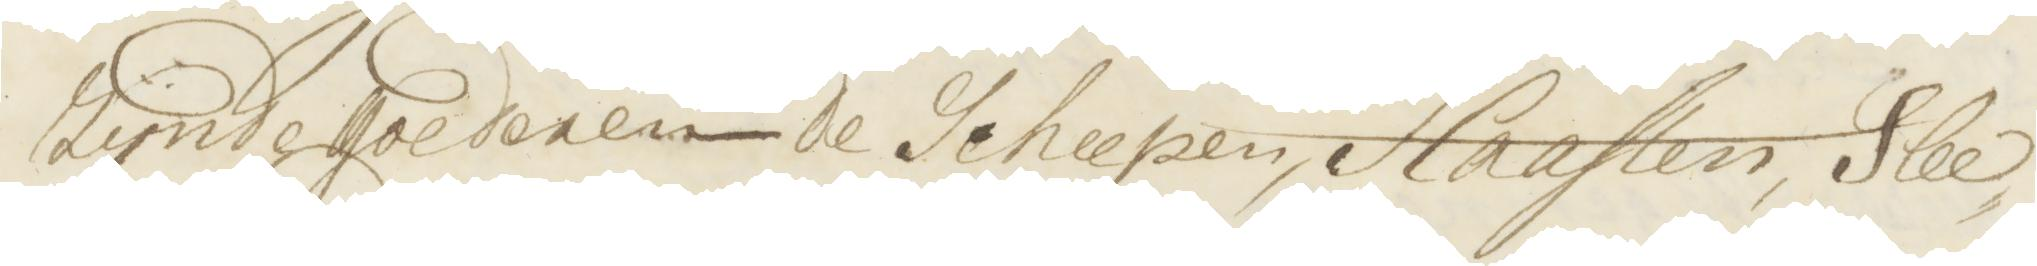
zijnde goederen de scheepen, Haaften, Slee„
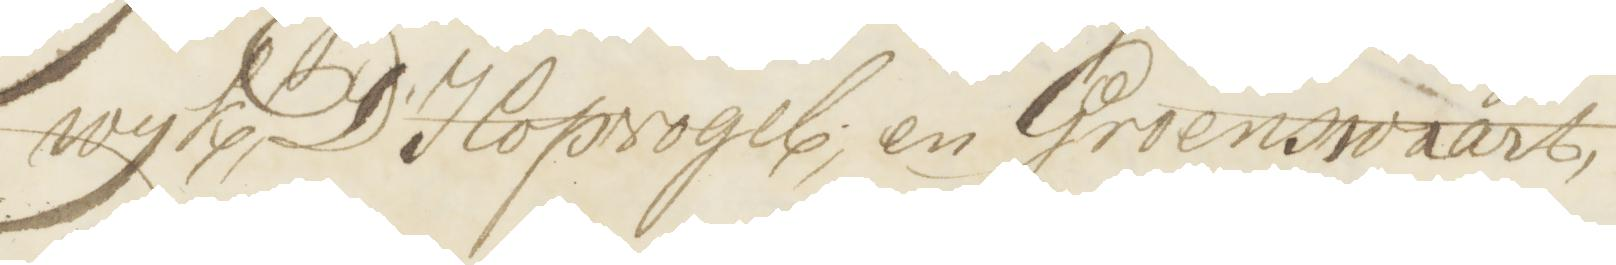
wyk D'Hopvogel; en Groenswaart,
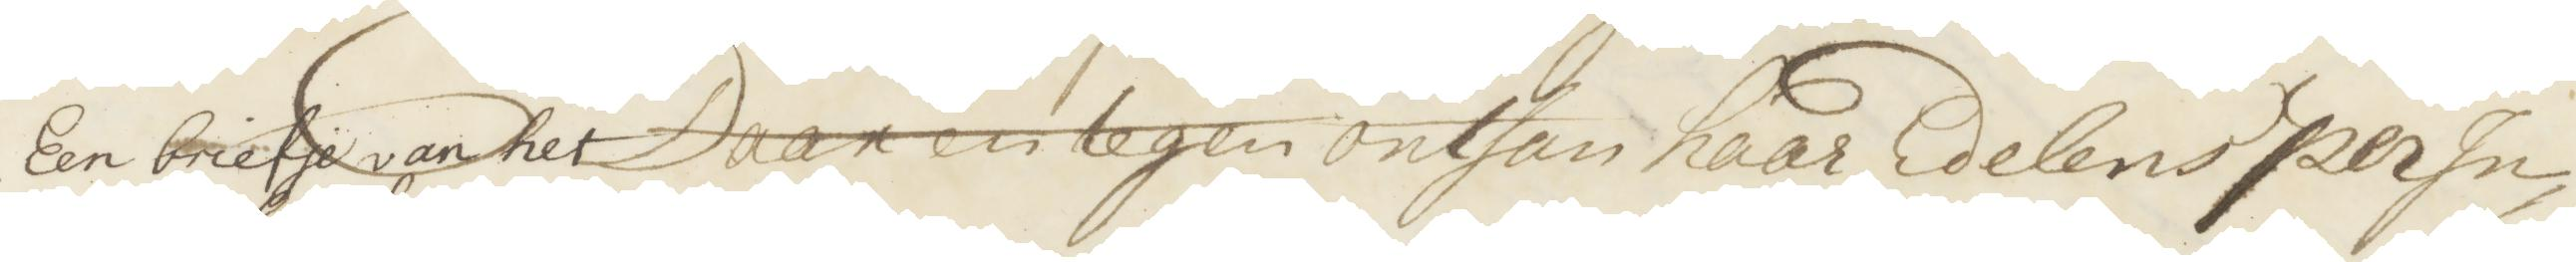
Een briefje van het Daar en tegen ontfan haar Edelens per Jn„
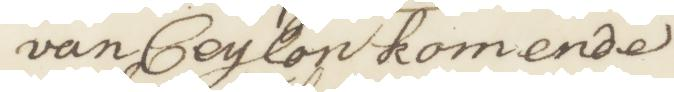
van Ceylon komende
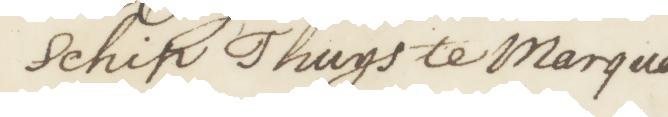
schip Thuys te Marqu
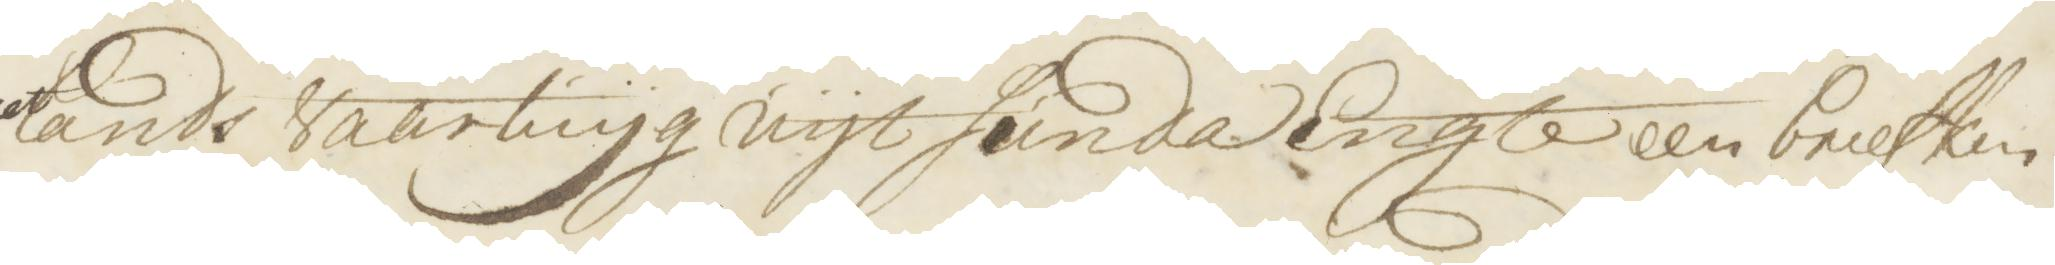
et lands vaartuijg uijt Sunda Engte een briefken
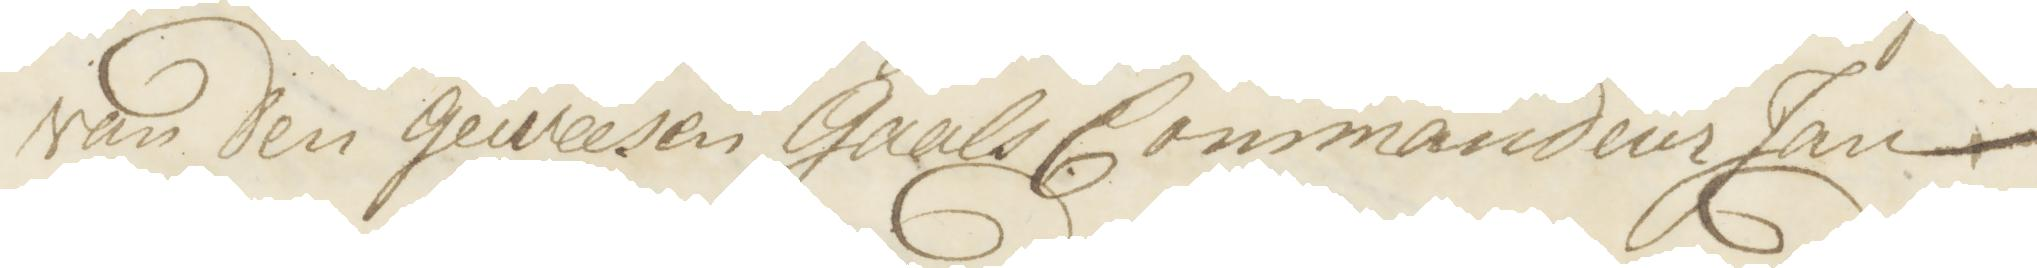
van den geweesen Gaals Commandeur Jan
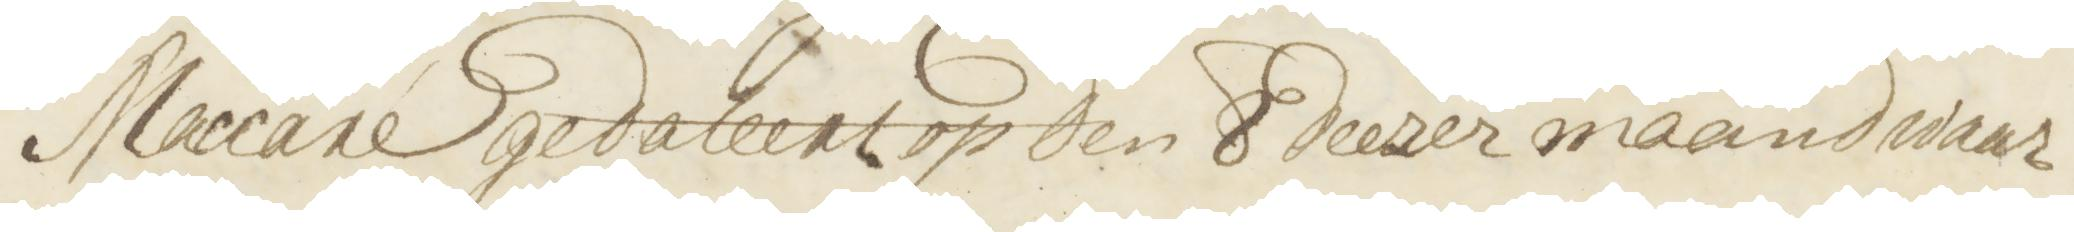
Maccaré gedateert op den 8 deezer maand waar
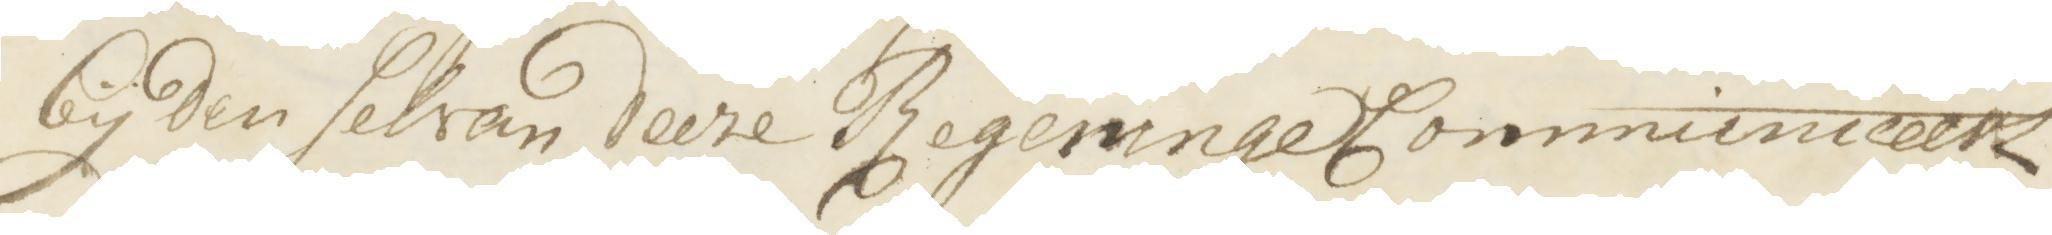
bij den selv an deeze Regeringe Communiceert
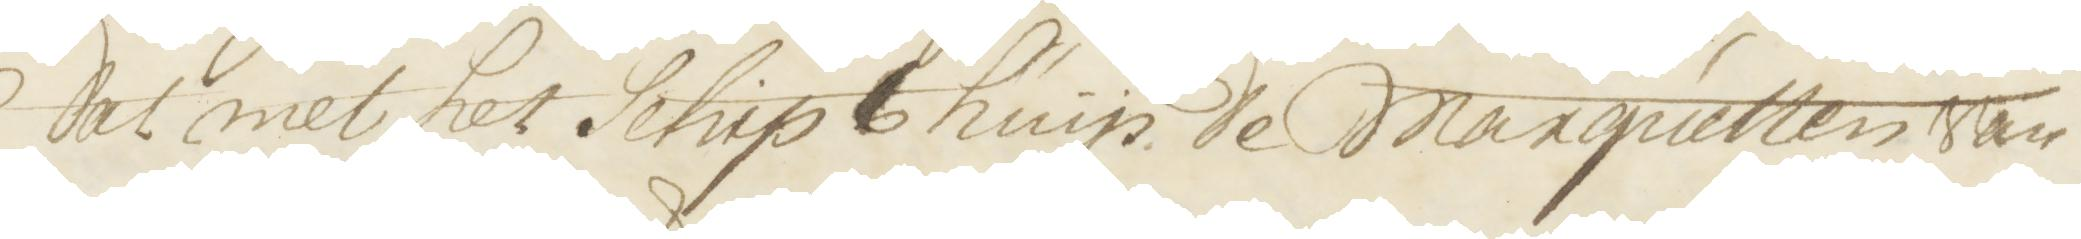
dat met het schip t huijs de marquetten van
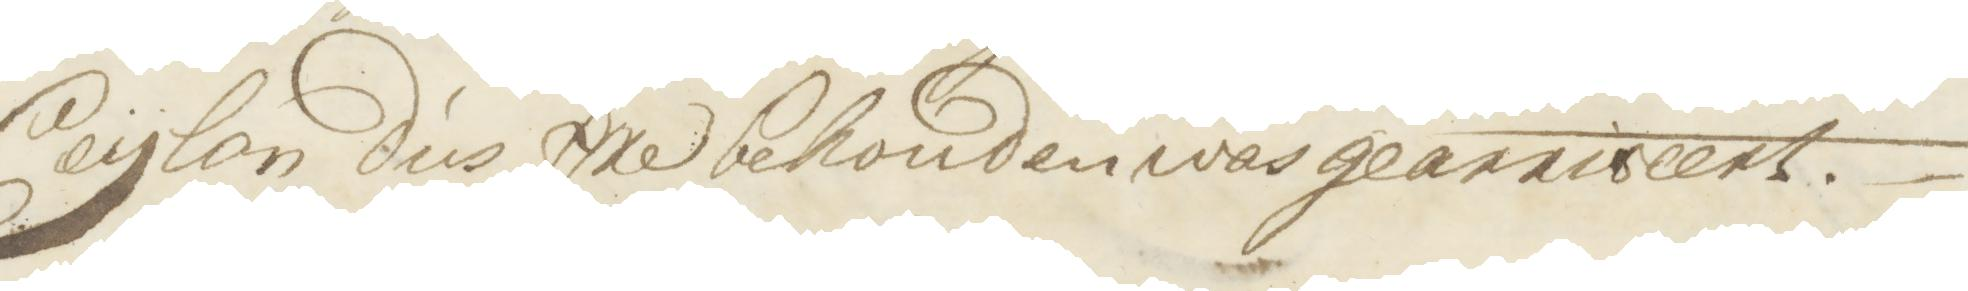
eijlon dus verre behouden was gearriveert.
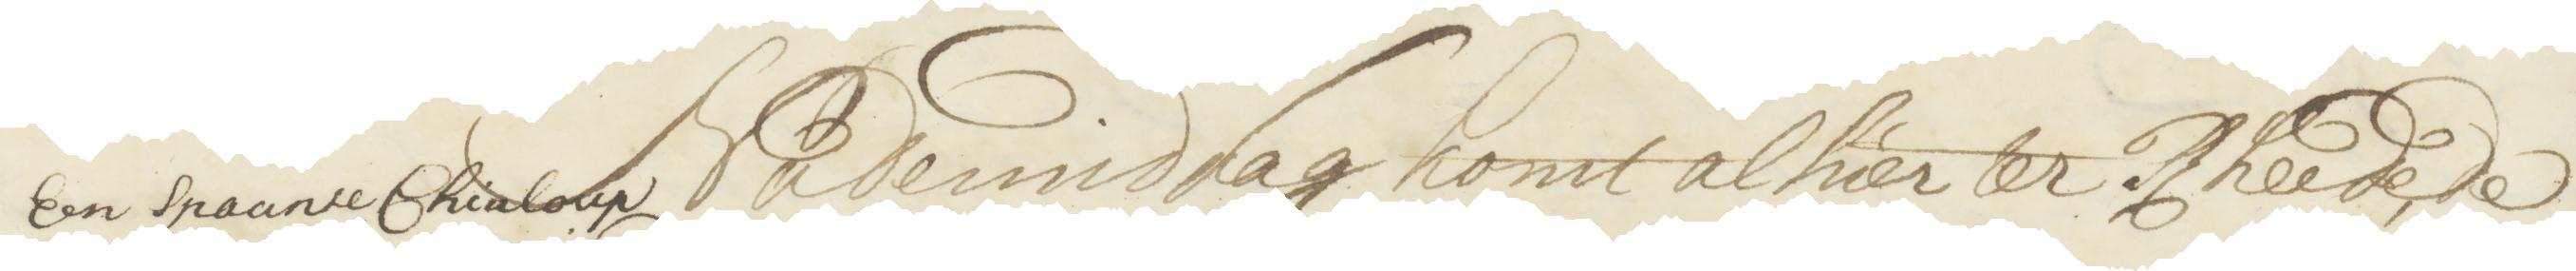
Een spaanse Chialoup Na de middag komt alhier ter Rheede, de
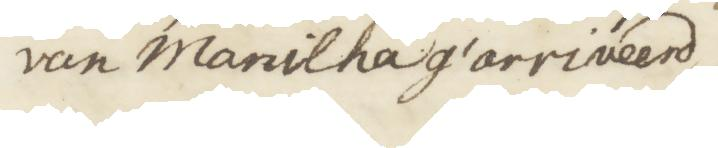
van Manilha g’arriveerd
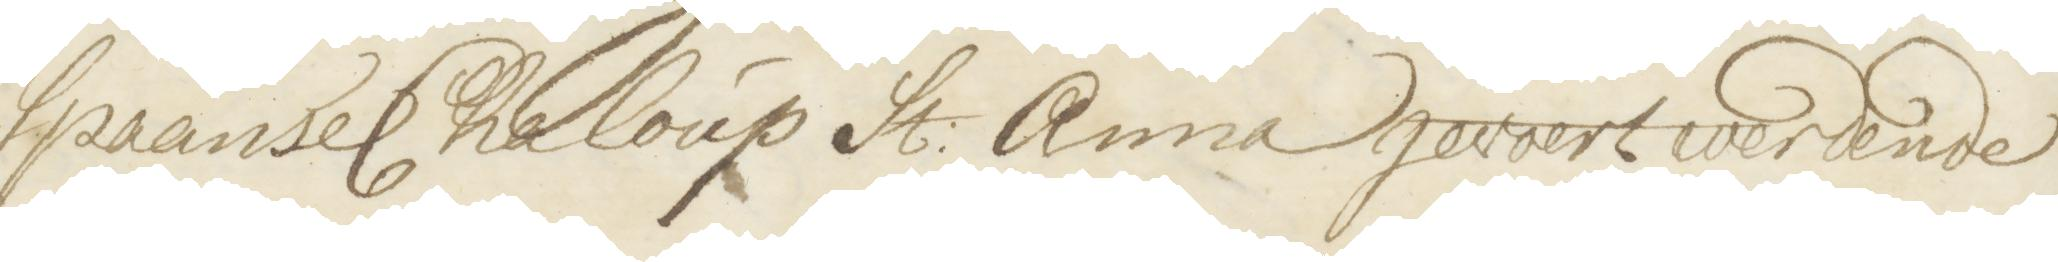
paanse Chaloup St: Anna gevoert werdende
